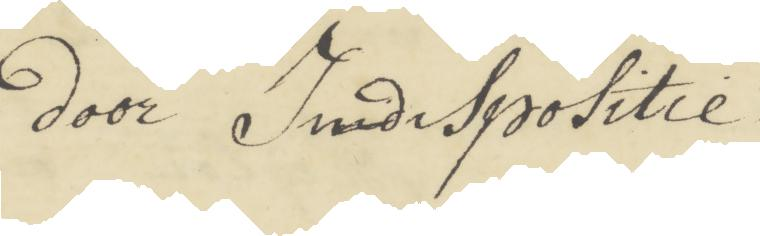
door Indispositie
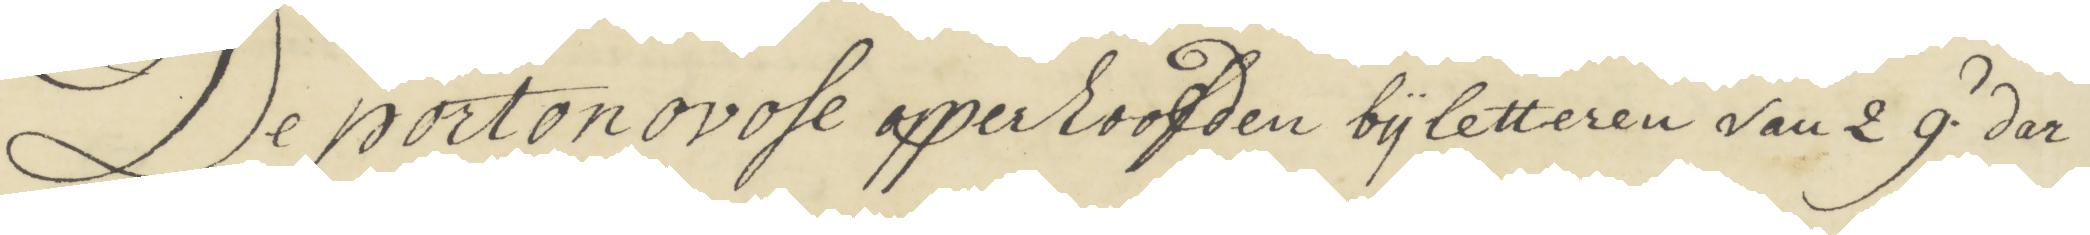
De portonovose opperhoofden bij letteren van 29.' der
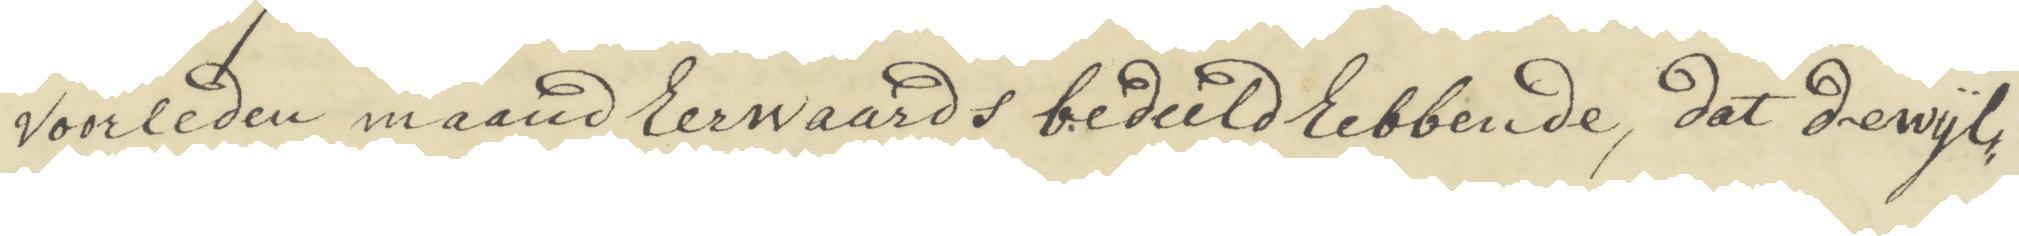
voorleden maand herwaards bedeeld hebbende, dat dewijl„
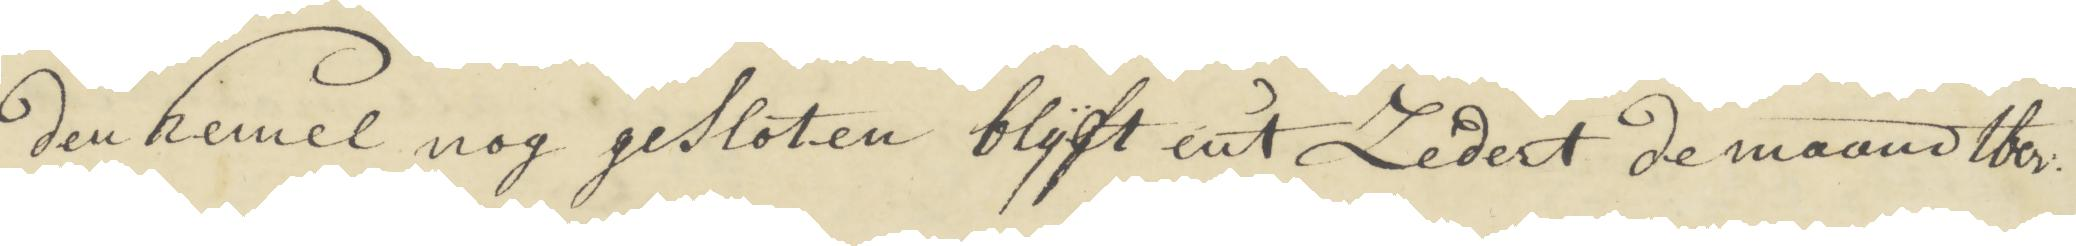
den hemel nog gesloten blijft en 't zedert de maand 7ber:
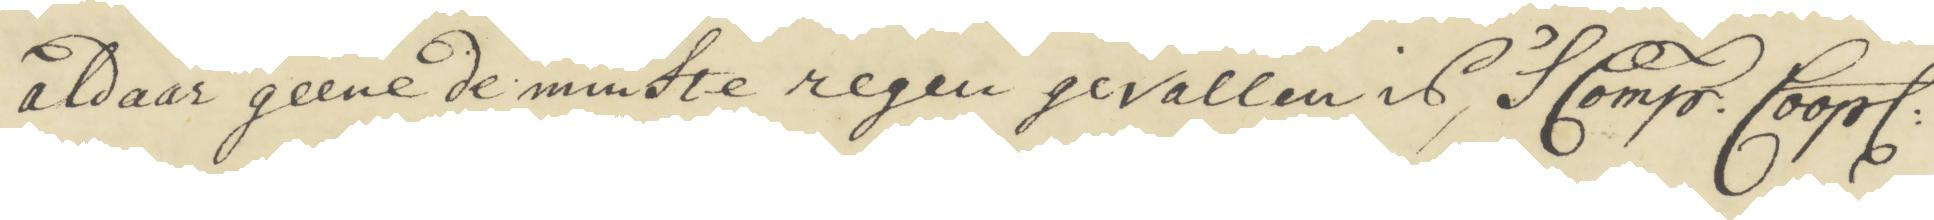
aldaar geene de minste regen gevallen is, ’s Comp: Coopl:
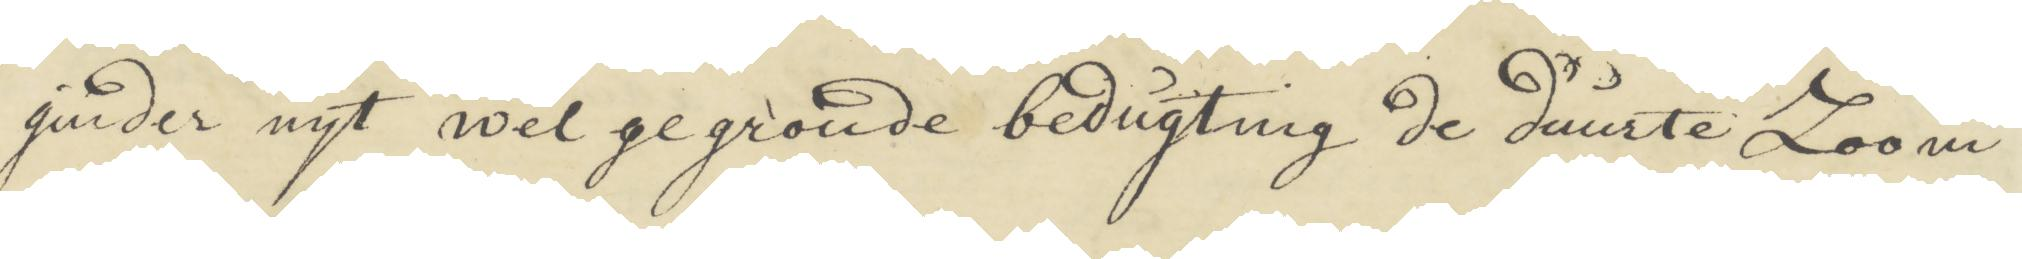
ginder uijt wel gegronde bedugting de duurte zoo in
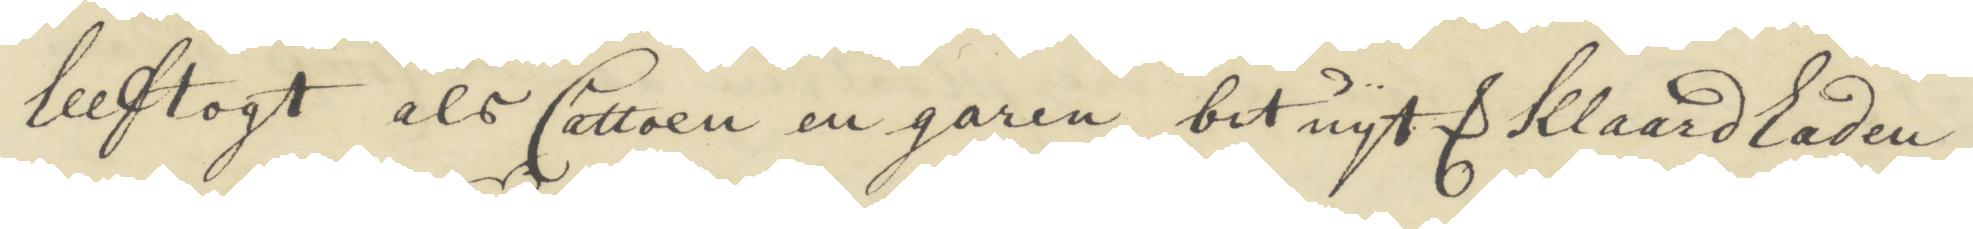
leeftogt als Cattoen en garen, bet uijt verklaard haden,
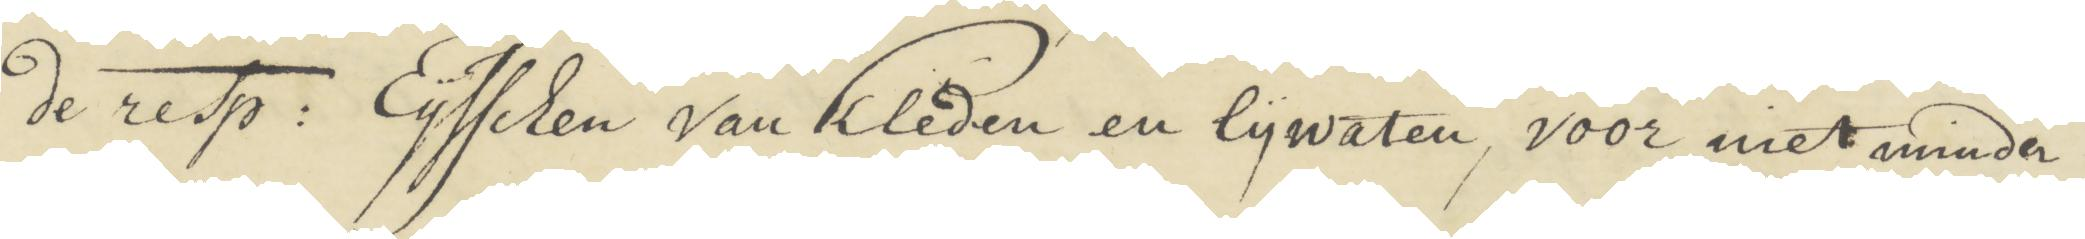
de resp: Eijsschen van kleden en lijwaten, voor niet minder
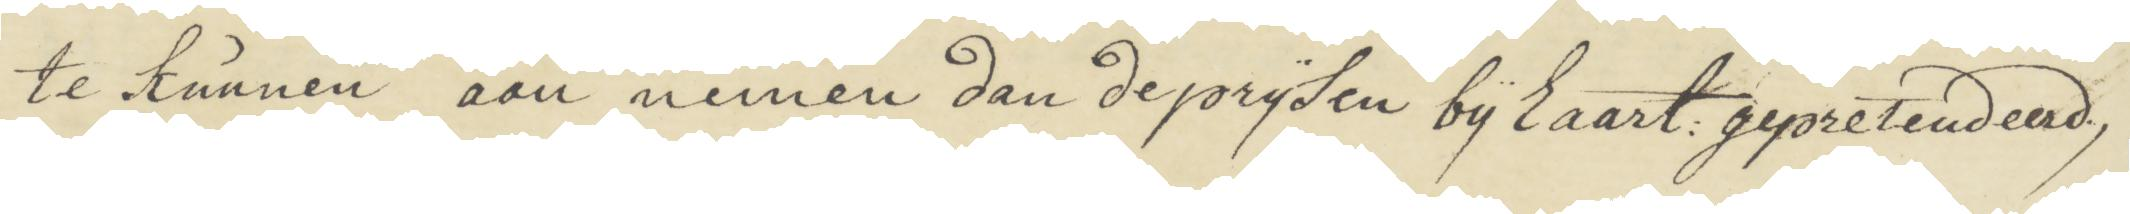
te kunnen aan nemen dan de prijsen bij haarl: gepretendeerd,
